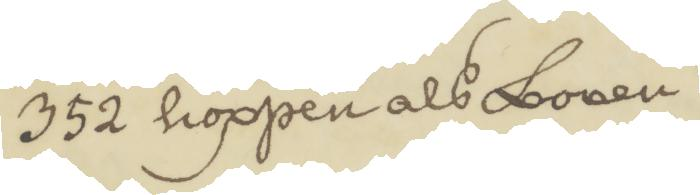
352 koppen als boven
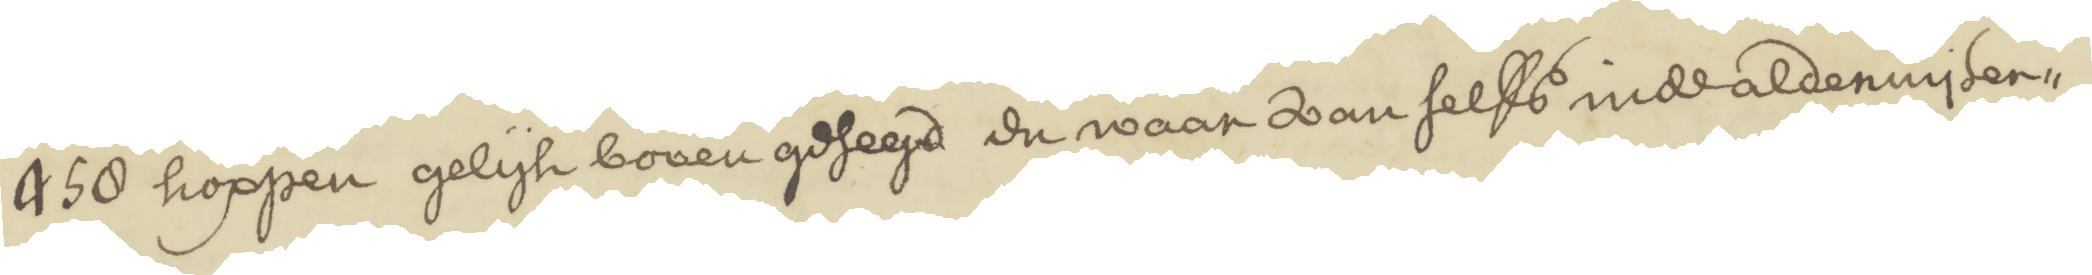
458 koppen gelijk boven gesegd en waar van selfs inde alderuijter„
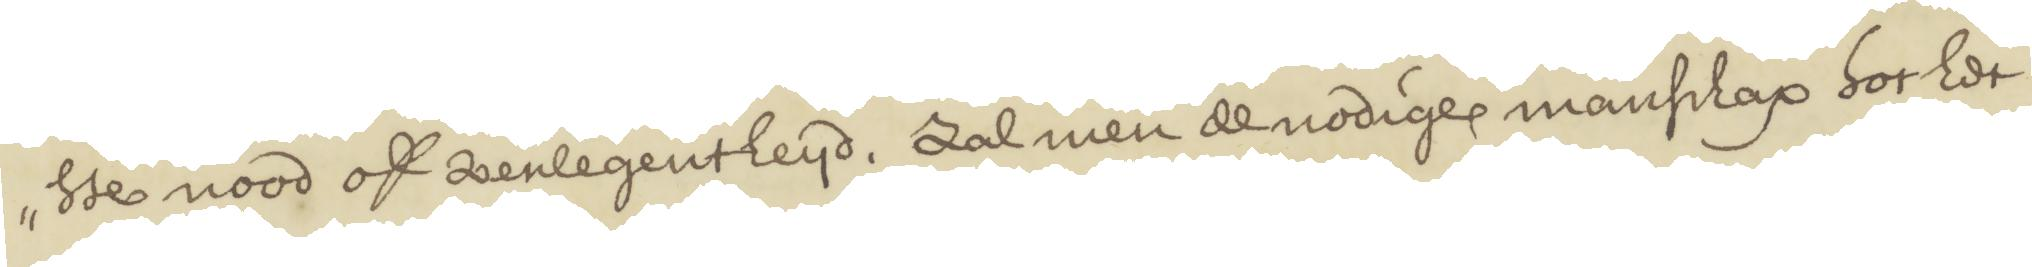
„ste nood of verlegentheyd, zal men de nodige manschap tot het
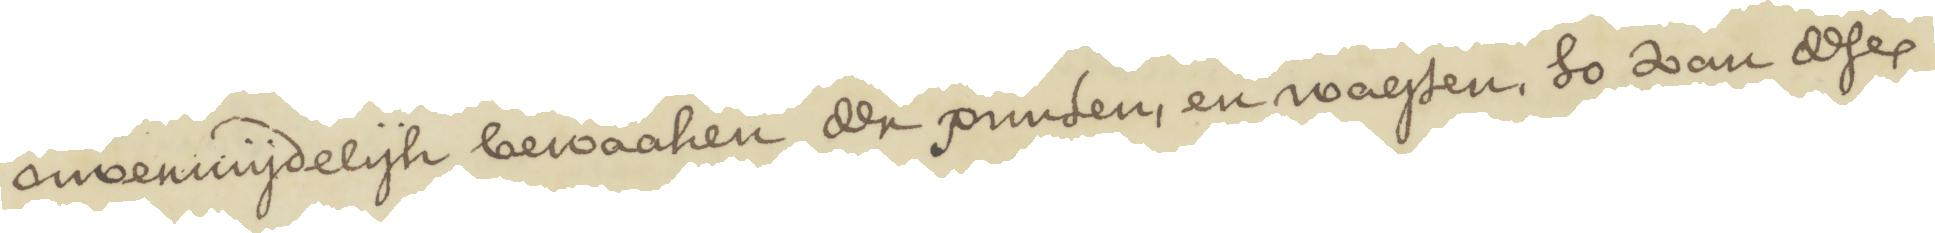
onvermijdelijk bewaaken der punten, en wagten, so van dese
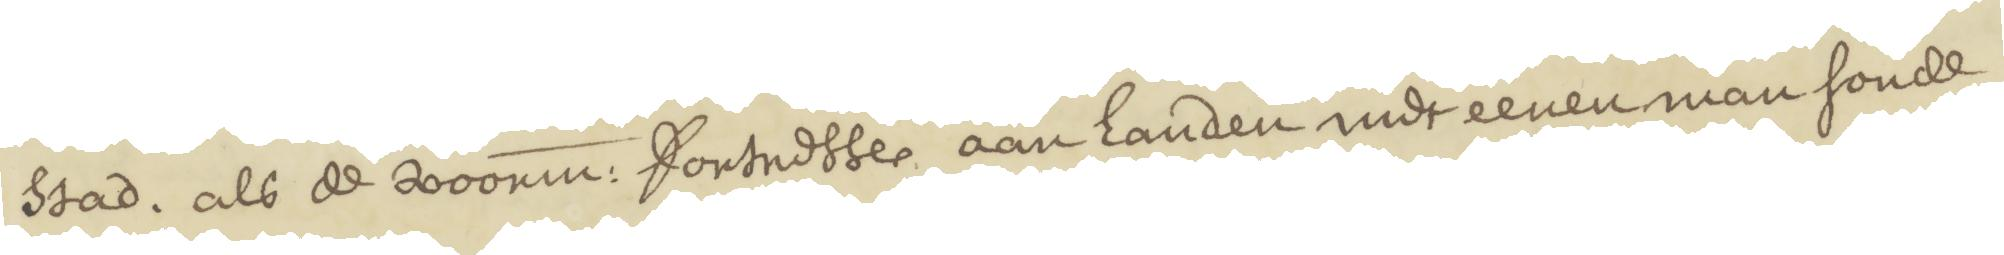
stad, als de voorm: fortresse aan handen niet eenen man soude
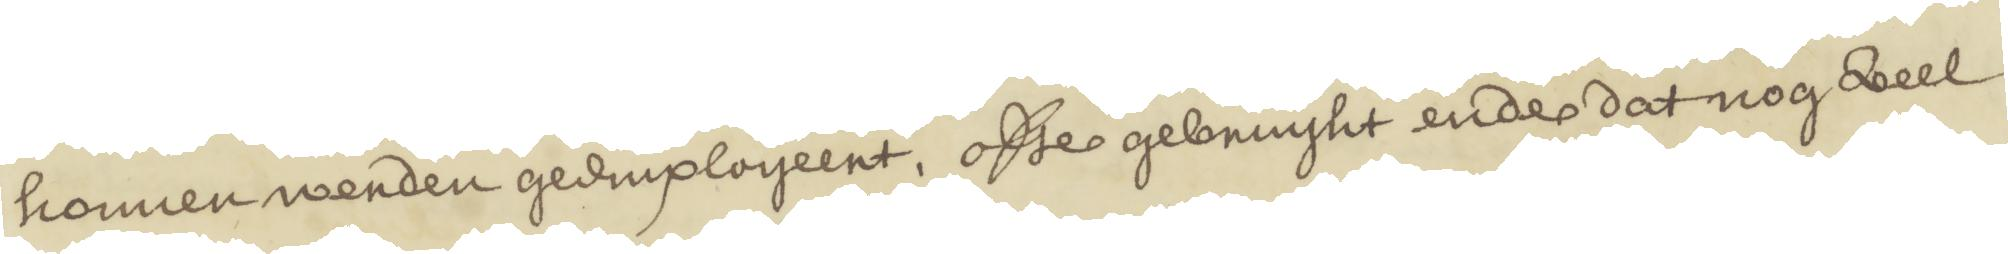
konnen werden geemploijeert, ofte gebruijkt ende dat nog veel
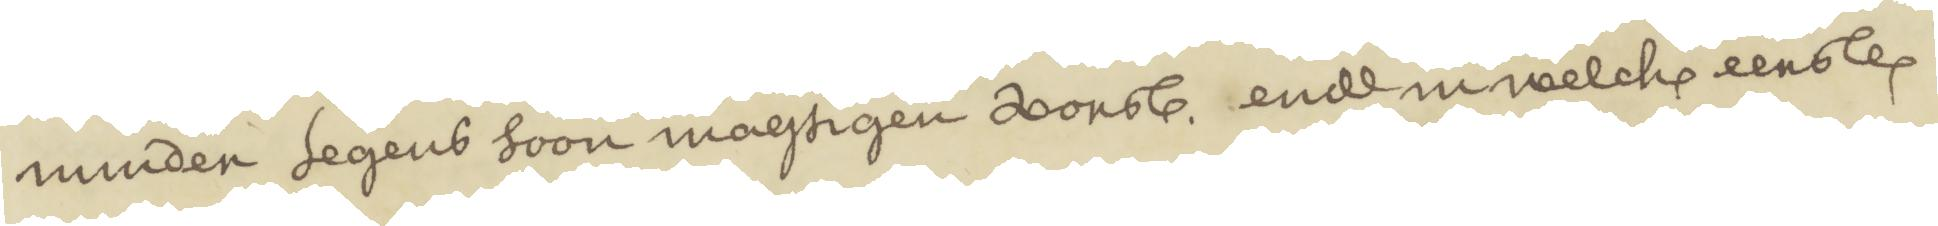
minder tegens soon magtigen vorst, ende in welck eerste
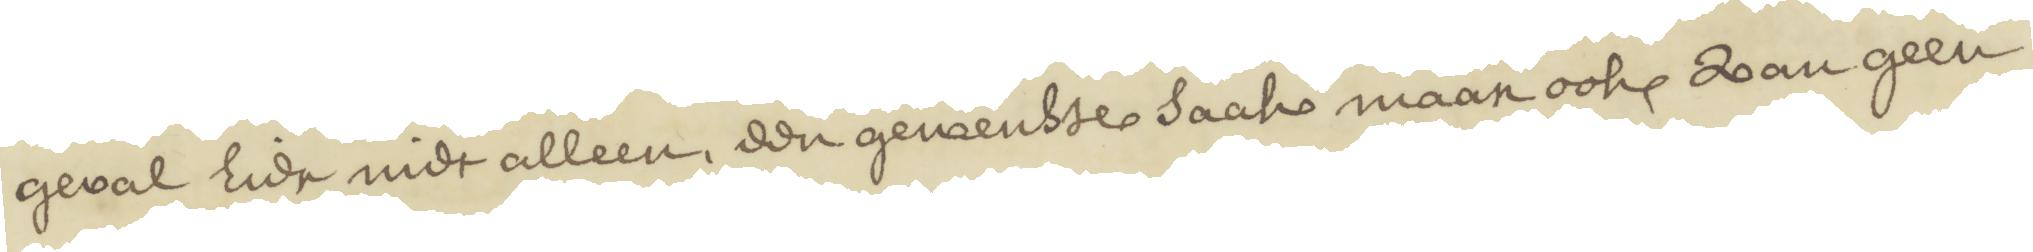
geval hier niet alleen, een gewenste saak maar ook van geen
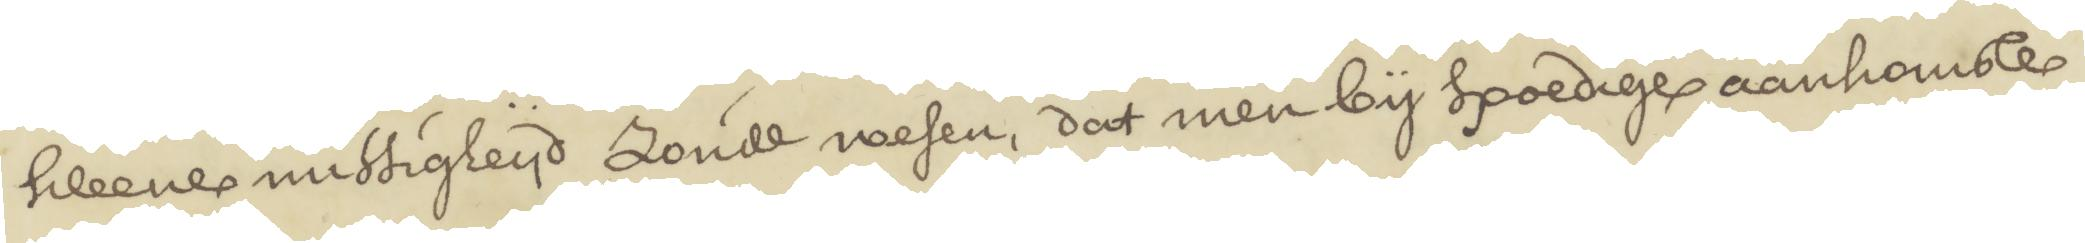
kleene nuttigheijd zoude wesen, dat men bij spoedige aankomste
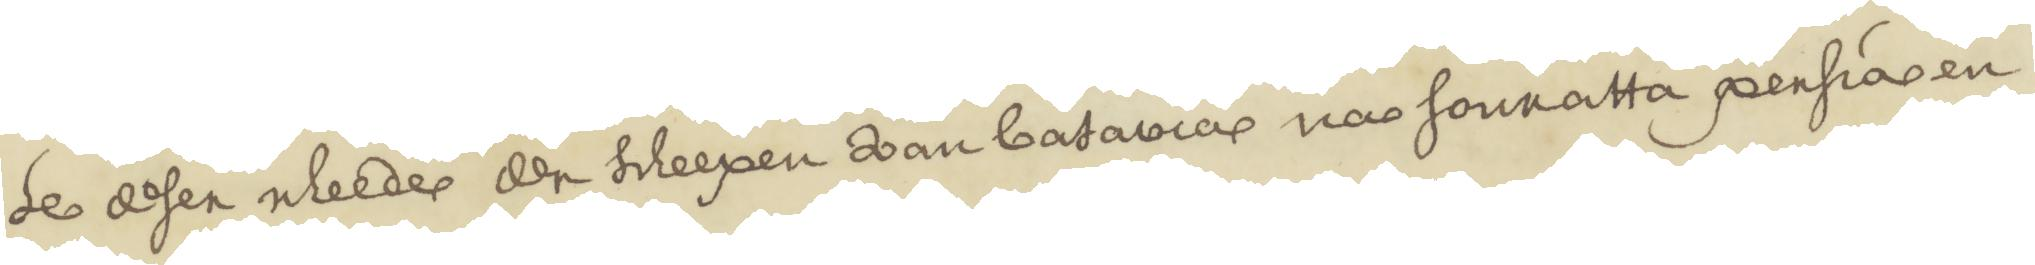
te deser rheede der scheepen van batavia na souratta persia en
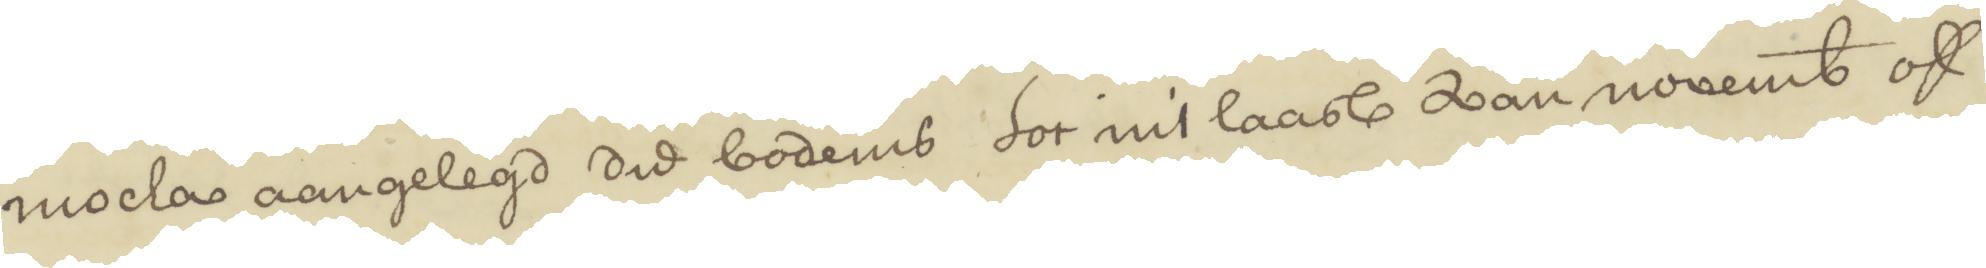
mocha aangelegd die bodems tot in't laast van novemb of
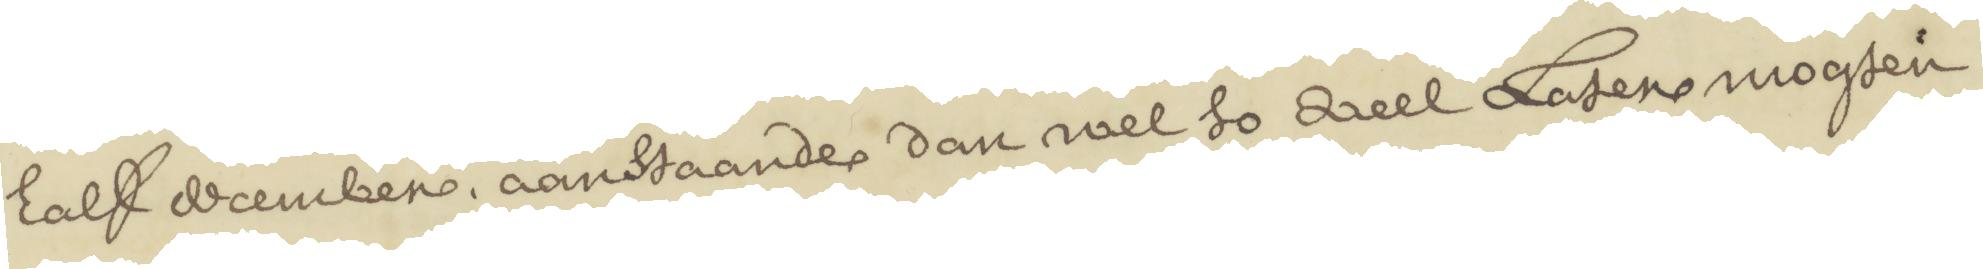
half december, aanstaande dan wel so veel later mogten
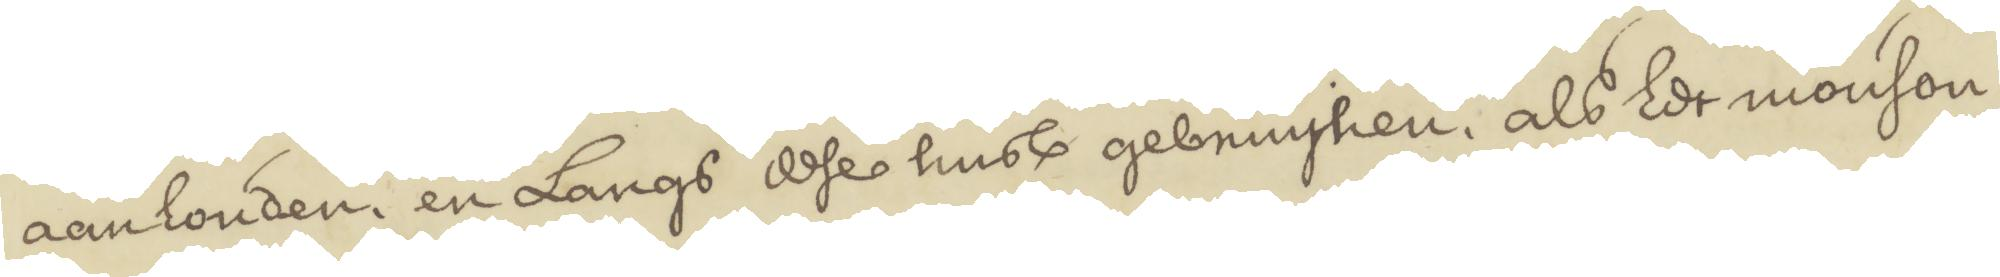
aanhouden. en langs dese kust gebruijken, als het mouson
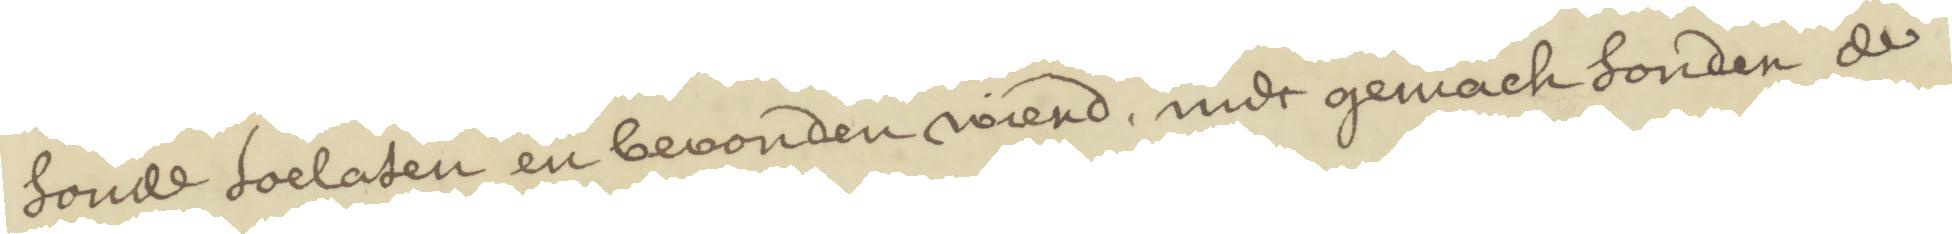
soude toelaten en bevonden wierd, met gemack sonder de
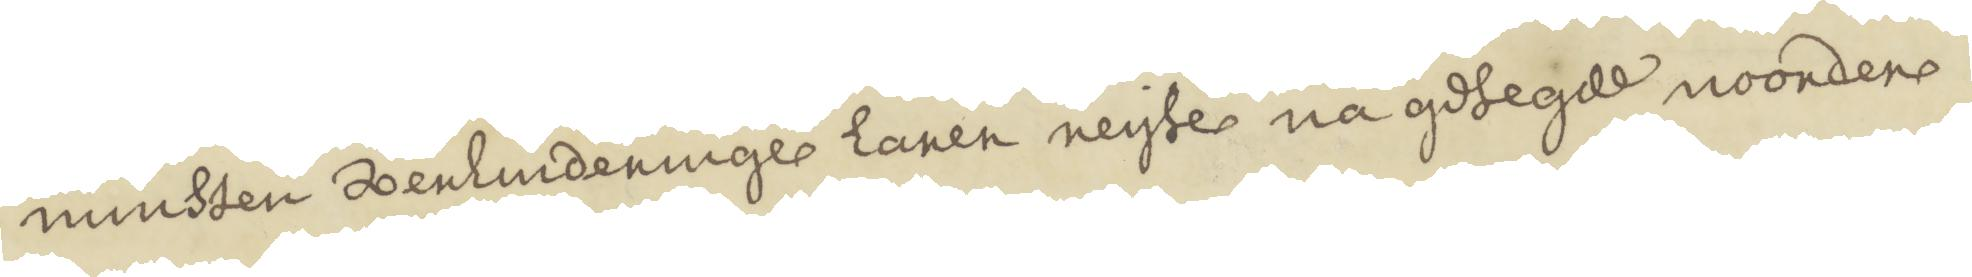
minsten verhinderinge haren reijse na gesegde noorder
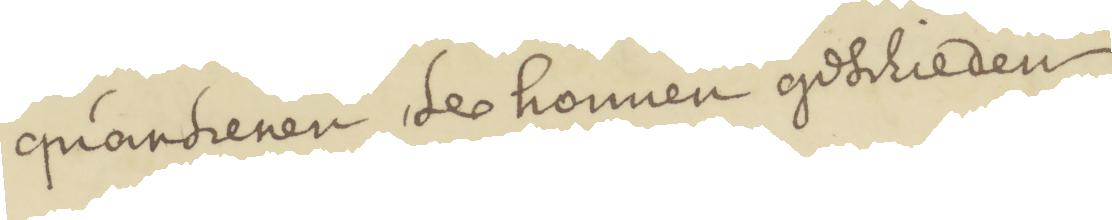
quartieren, te konnen geschieden
